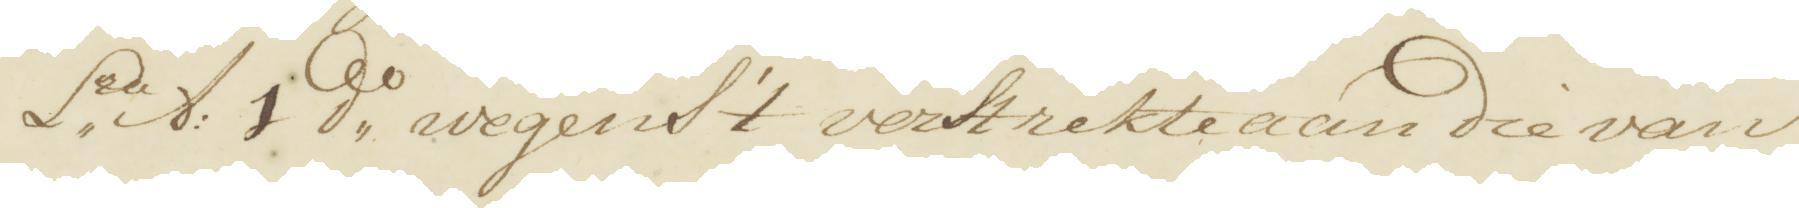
L:ra A: 1 d„o wegens ’t verstrekte aan die van
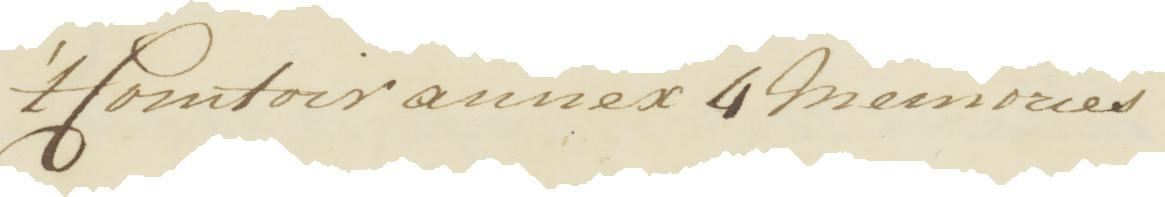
’t Comtoir annex 4 memories
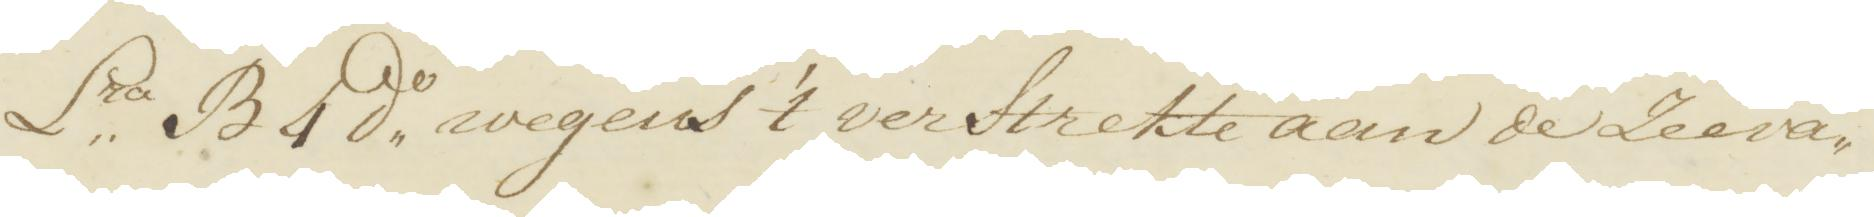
L„ra B 4 d„o wegens ’t verstrekte aan de zeeva„
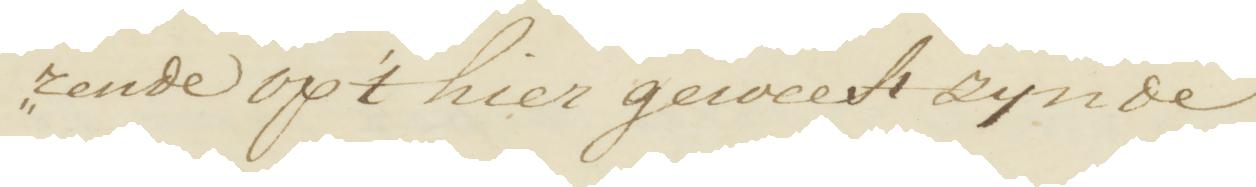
„rende op ’t hier geweest zynde
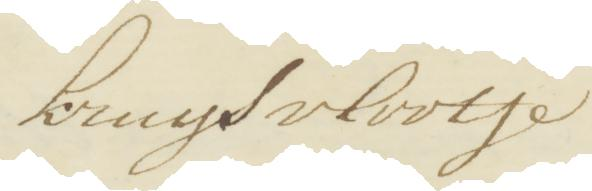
kruys vlootje
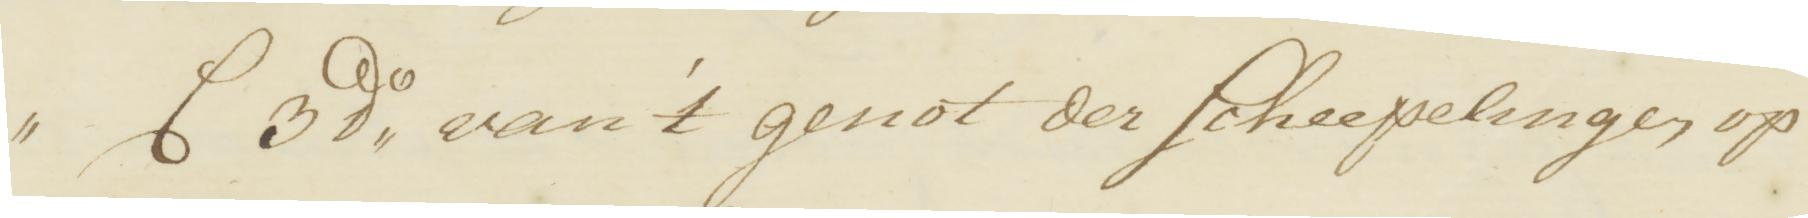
„ C 3 d„o van ’t genot der scheepelingen op
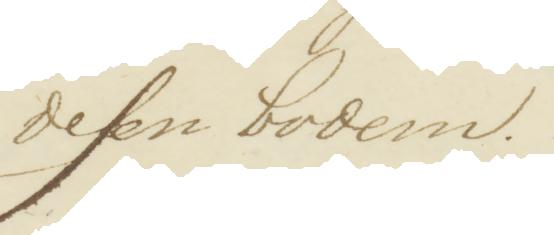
desen bodem.
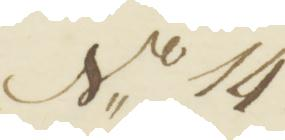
N„o 14
